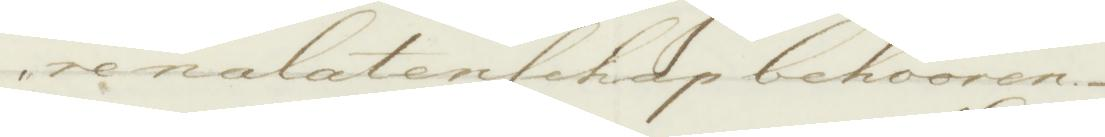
„re nalatenschap behooren. —
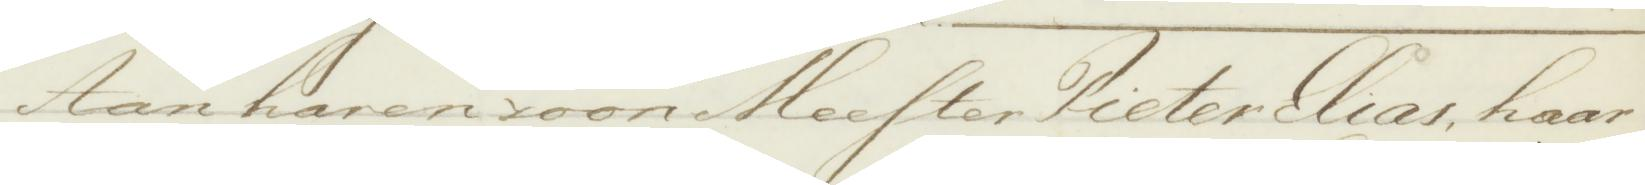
Aan haren zoon Meester Pieter Elias, haar
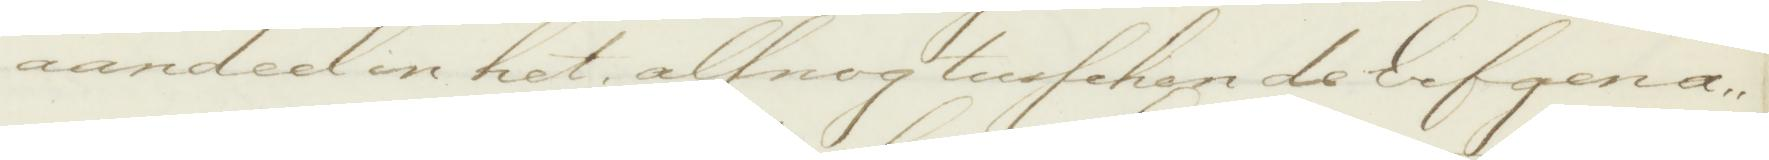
aandeel in het, alsnog tusschen de Erfgena„
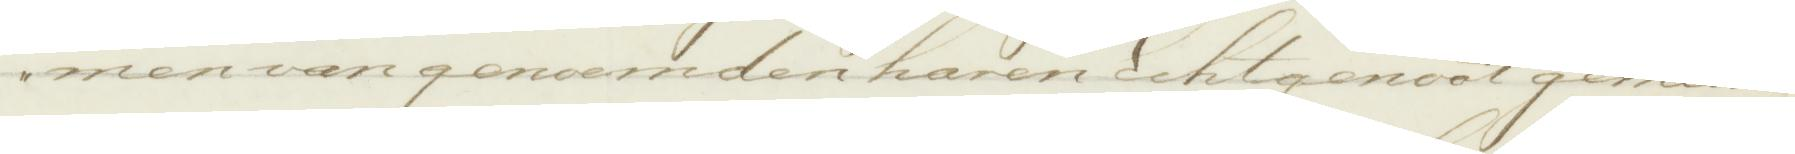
„men van genoemden haren Echtgenoot gemeen
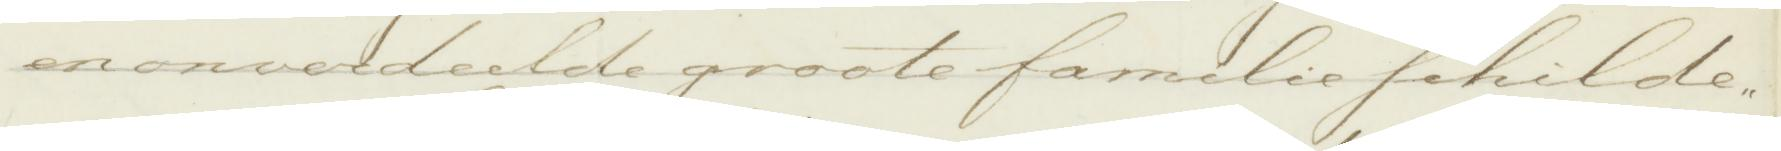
en onverdeelde groote familie schilde„
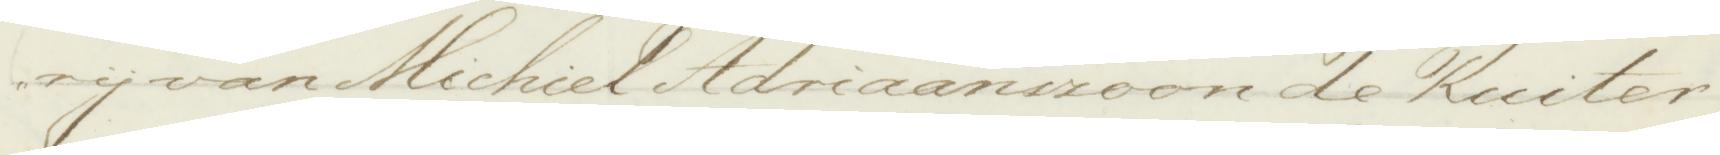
„rij van Michiel Adriaanszoon de Ruiter
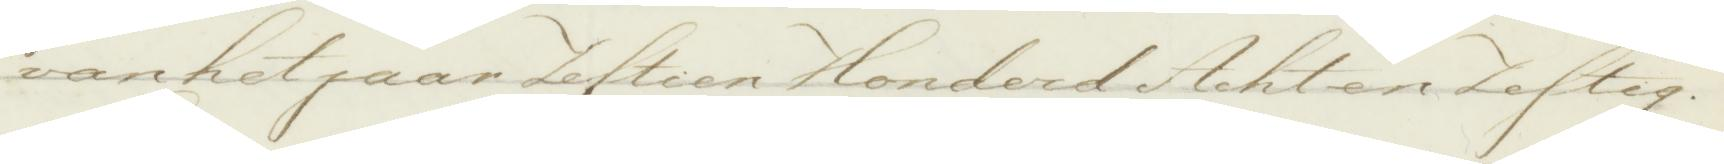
van het jaar Zestien Honderd Acht en Zestig.
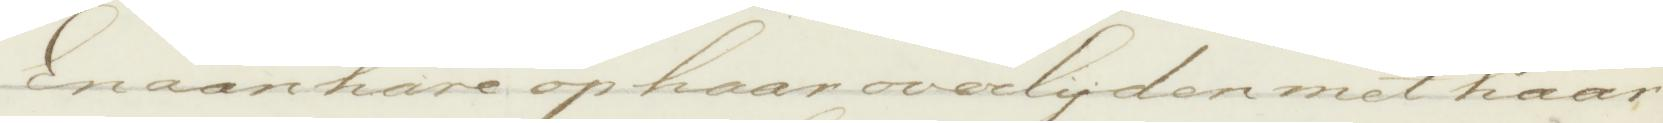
En aan hare op haar overlijden met haar
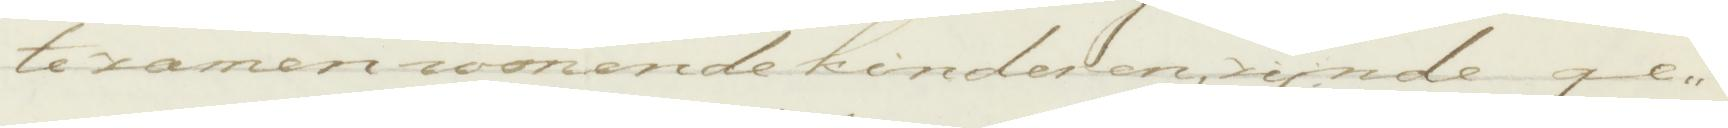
te zamen wonende kinderen zijnde ge„
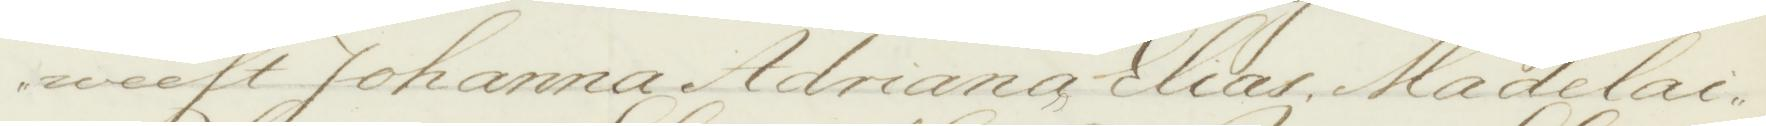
„weest Johanna Adriana Elias, Madelai„
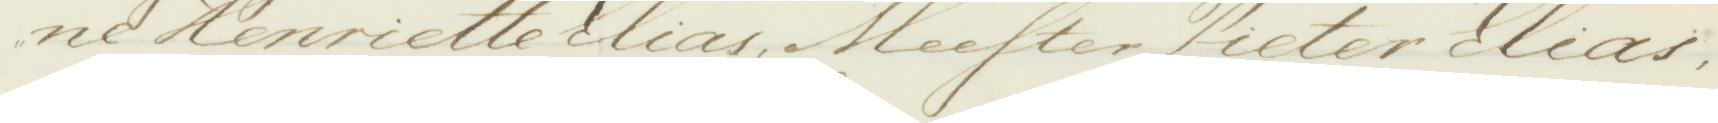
„ne Henriette Elias, Meester Pieter Elias,
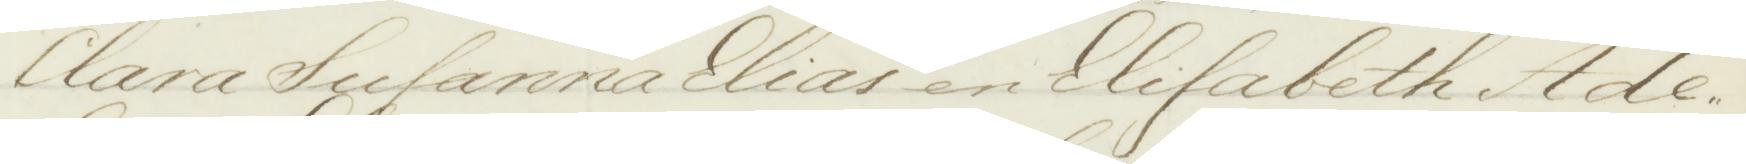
Clara Susanna Elias en Elisabeth Ade„
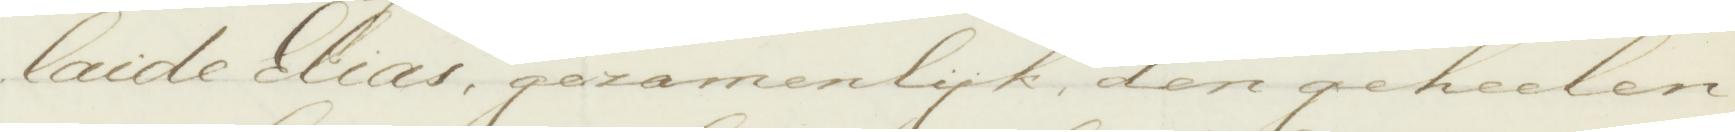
„laide Elias, gezamenlijk, den geheelen
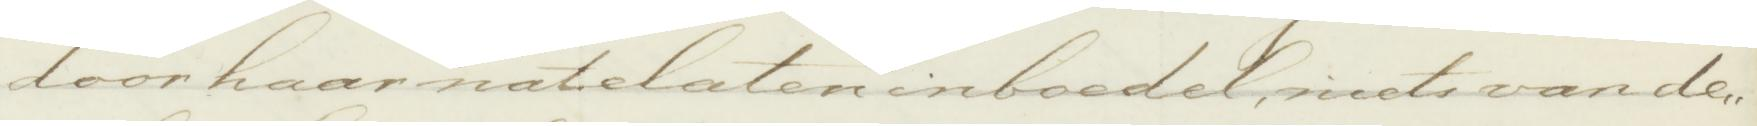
door haar natelaten inboedel, niets van de„
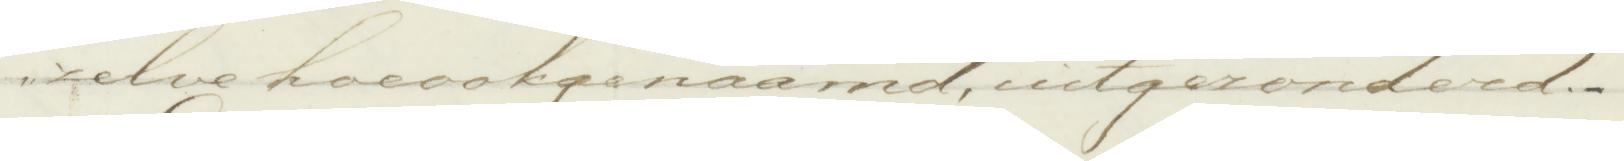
„zelve hoeookgenaamd, uitgezonderd. —
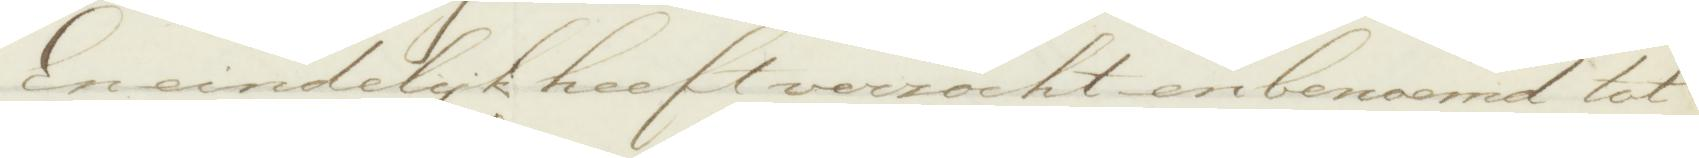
En eindelijk heeft verzocht en benoemd tot
